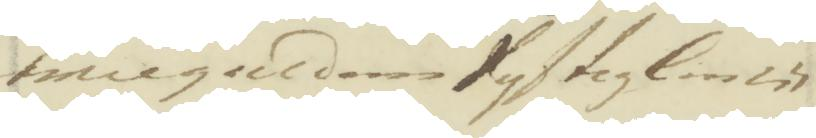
twee guldens Vyftig Cent
